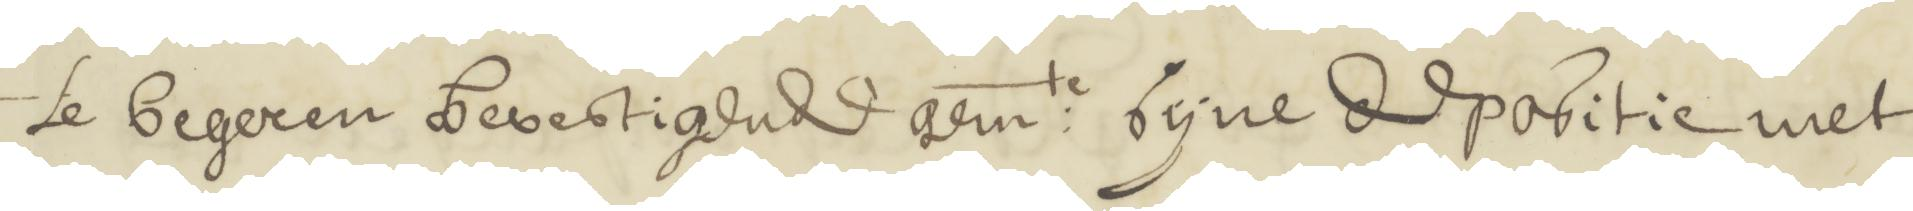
te begeren bevestigende gem:te sijne depositie met
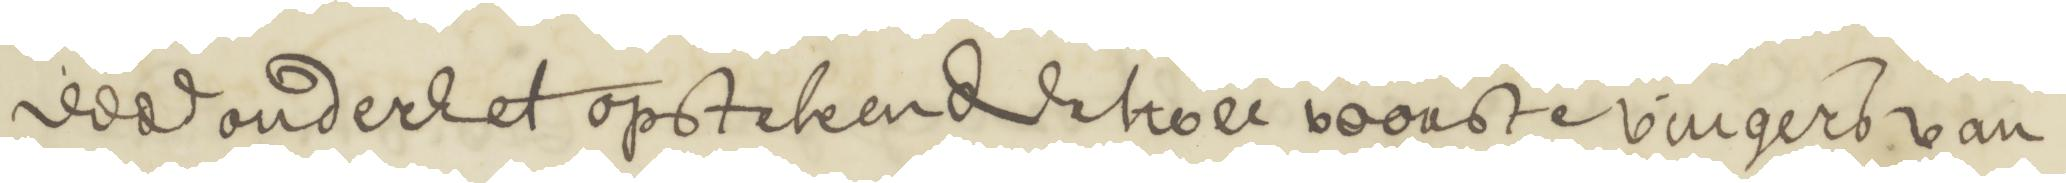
Eede onderhet opstekender twee voorste vingers van
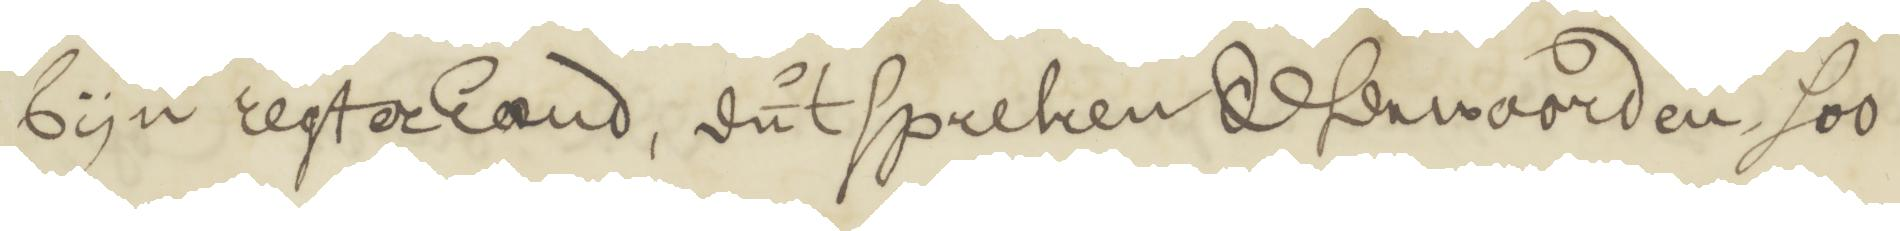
sijn regterhand, en ’t spreken deser woorden, Soo
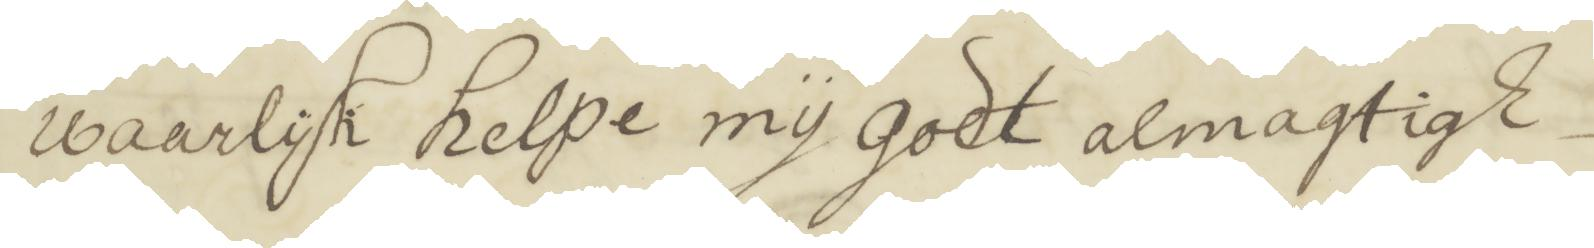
waarlijk helpe mij godt almagtigh
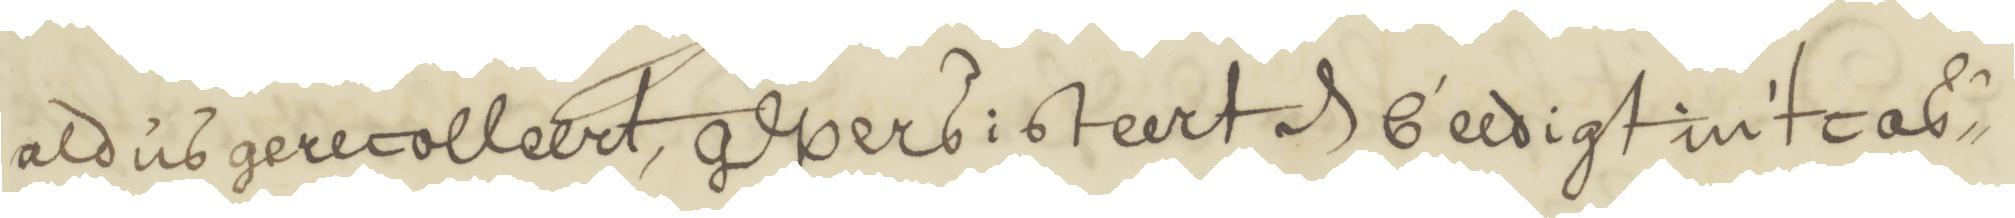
aldus gerecolleert, gepersisteert en b´eedigt in ’t cas„
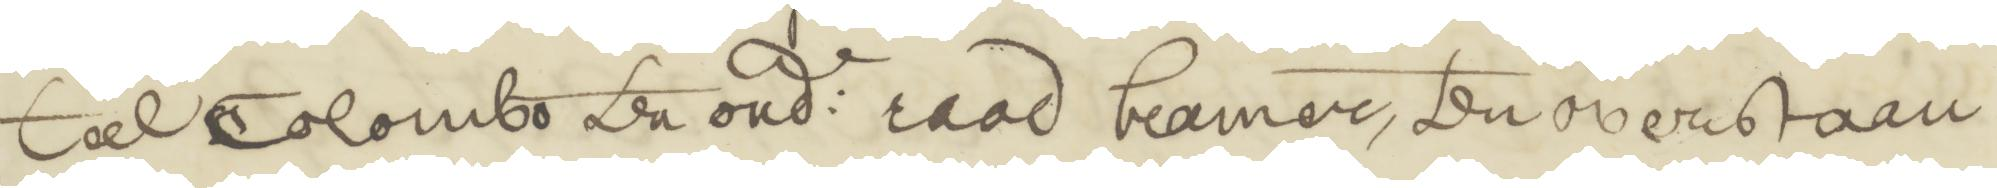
teel Colombo ter ord:' raadkamer, ten overstaan
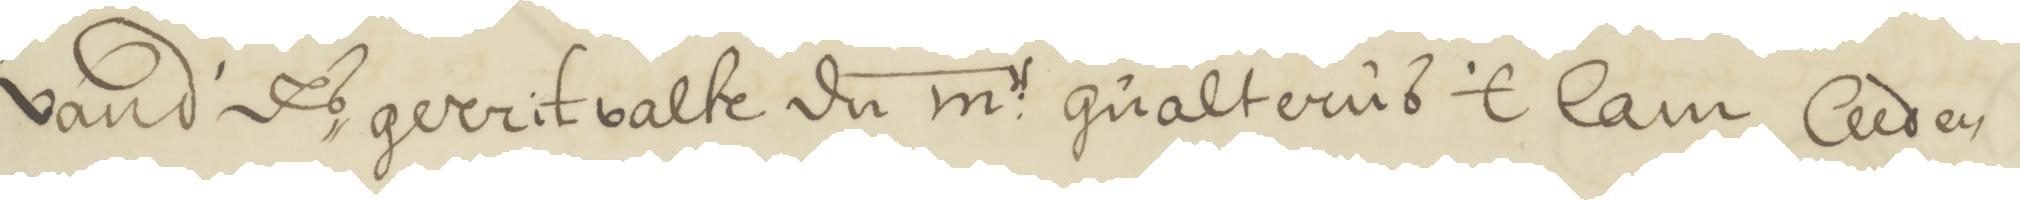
van d’ E„s gerrit valk en m:r gualterus 't lam leeden
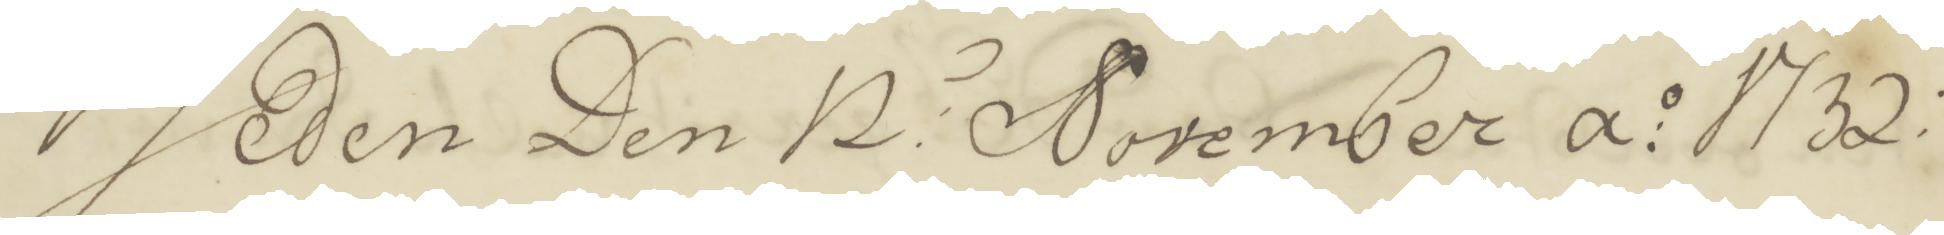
Heden Den 12:' November a:o 1732:
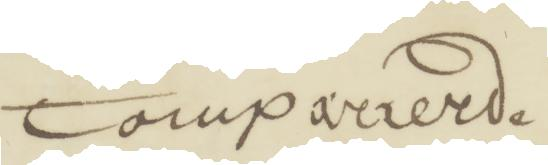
compareerde
